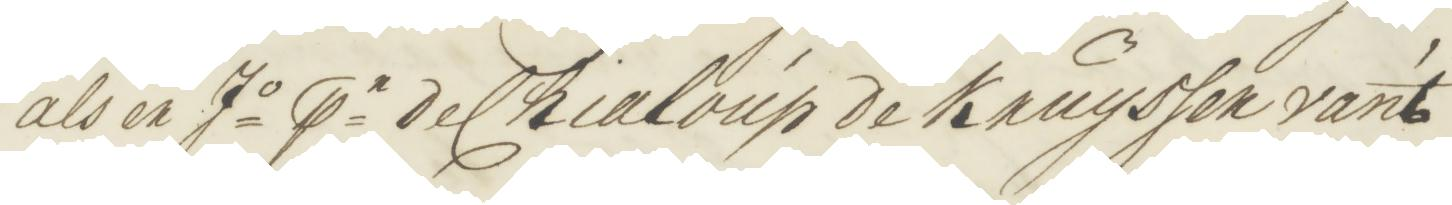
als 'er J=o p=r de Chialoup de Kruysser van't
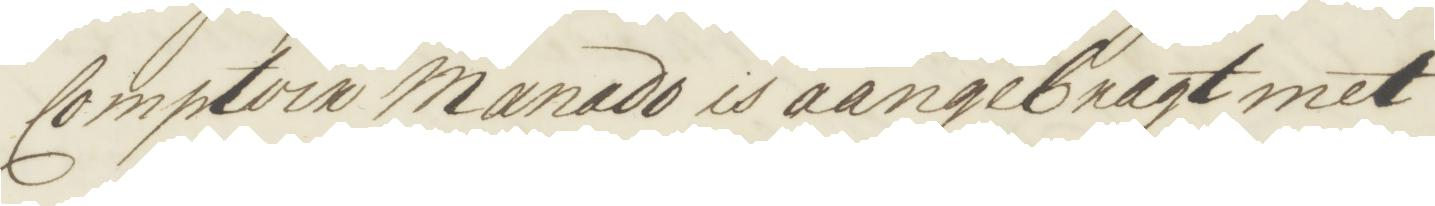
Comptoir Manado is aangebragt met
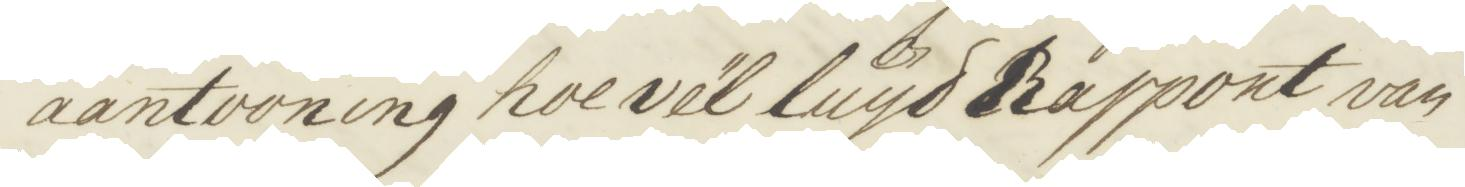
aantooning hoevël luijd Rapport van
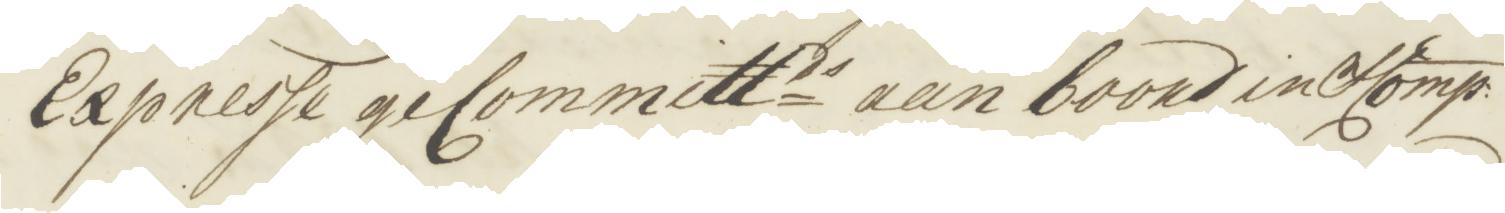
Expresse gecommitt=ds aan boord in SComp:
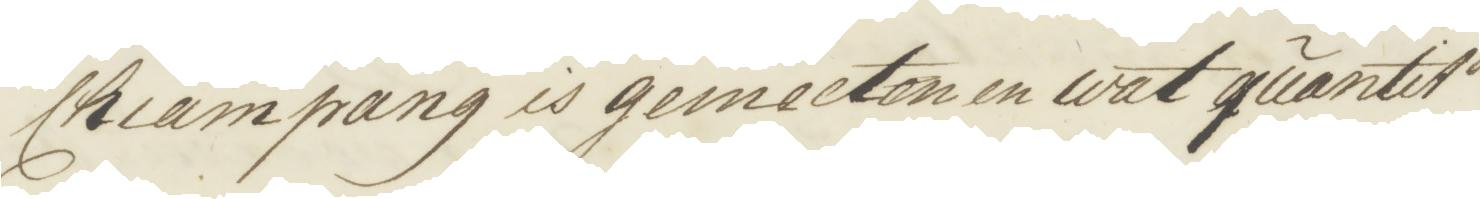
Chiampang is gemeeten en wat quantitd
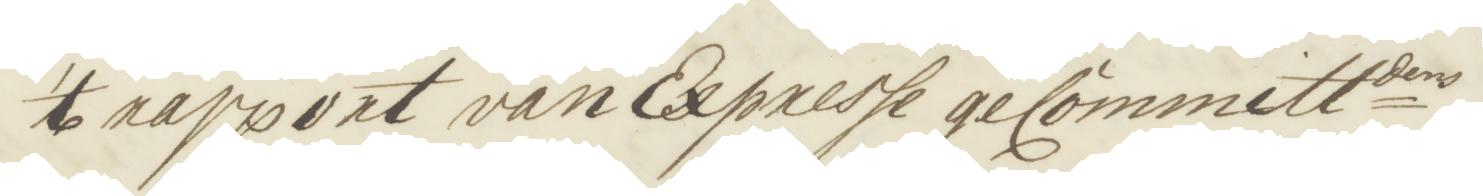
’t rapport van Expresse gecommitt=dens
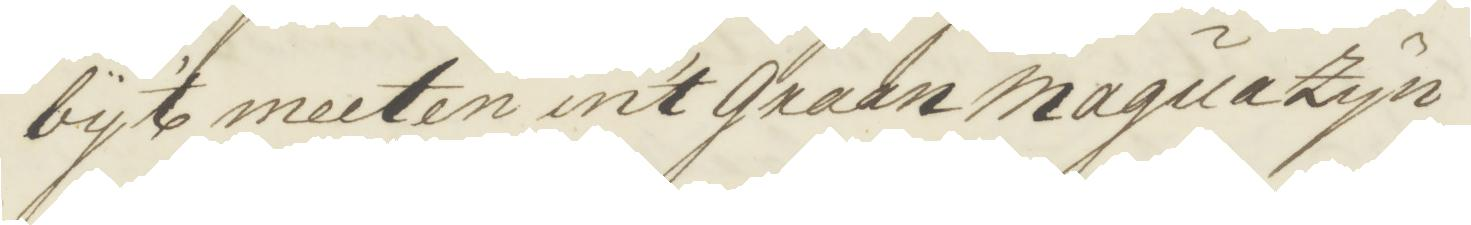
bij't meeten in’t graan maguazijn
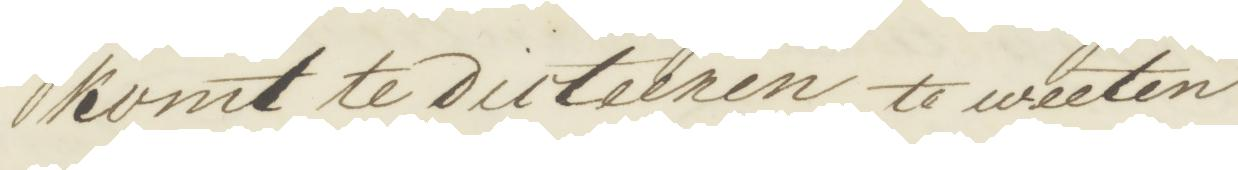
komt te dicteeren te weeten
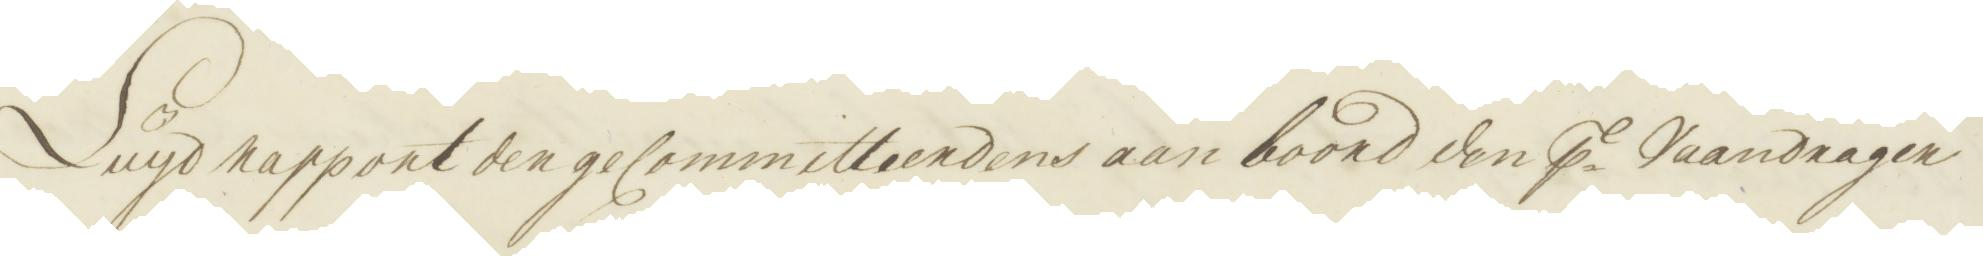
Luijd rapport den gecommitteerdens aan boord den p=l Vaandrager
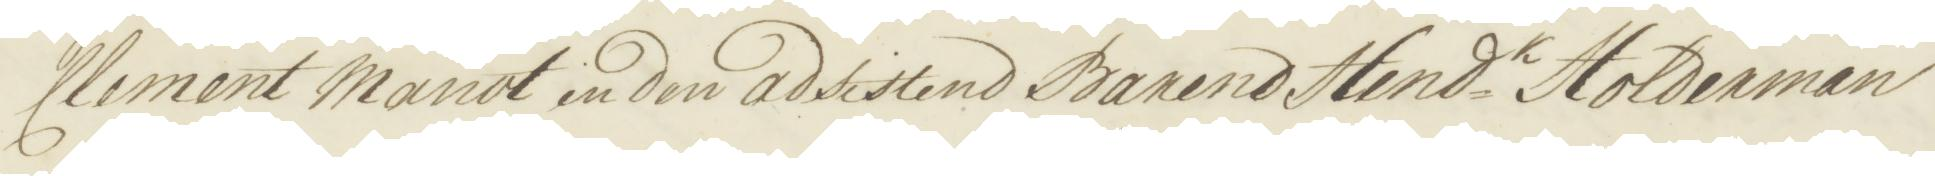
Clement Manot in den adsistend Barend Hend=k Holderman
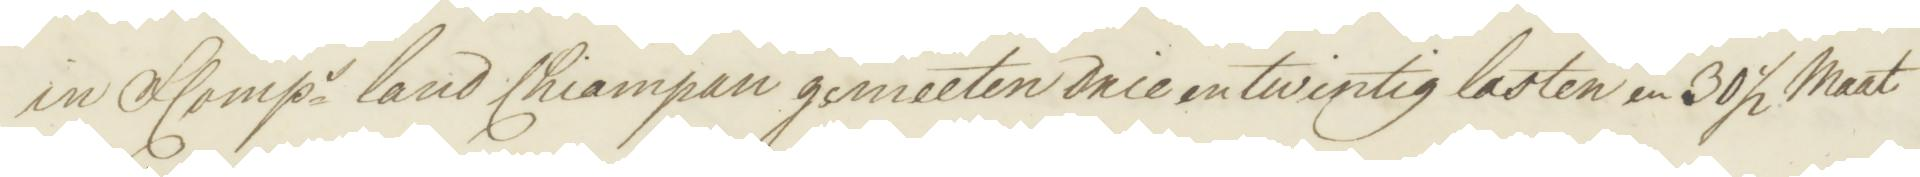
in SComp=s land Chiampan gemeeten drie en twintig lasten en 30½ maat
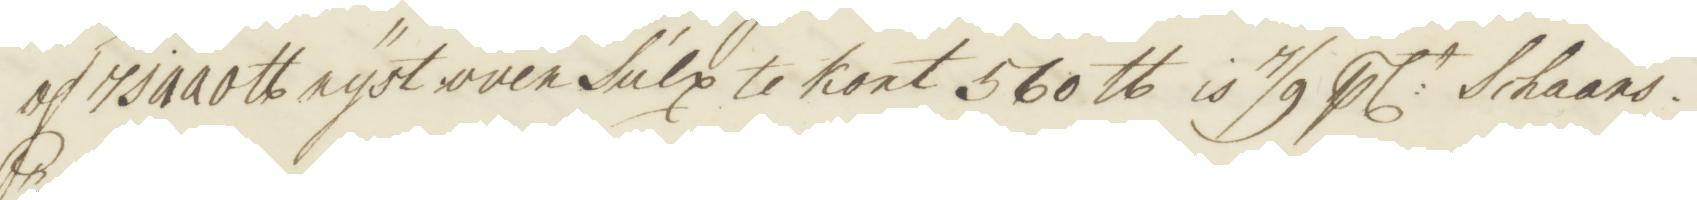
of 71440lb rijst over sulx te kort 560 lb is 7/9 pC:t schaars.
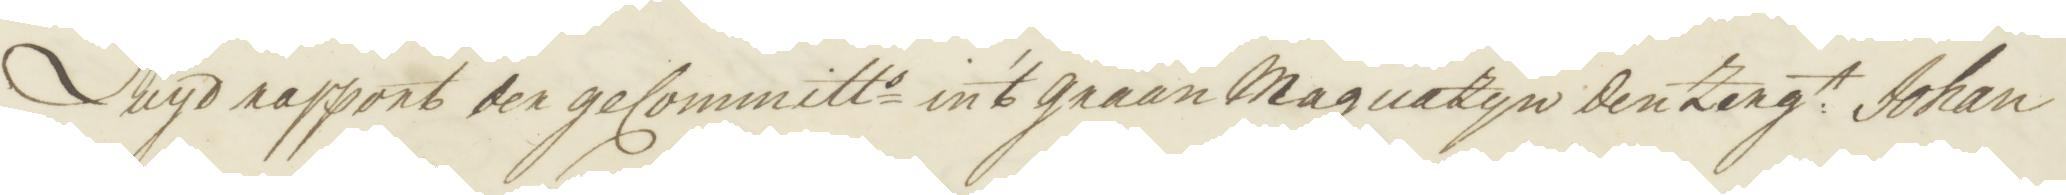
Luijd rapport der gecommitt=s in’t graan Maguazijn den zerg:t Iohan
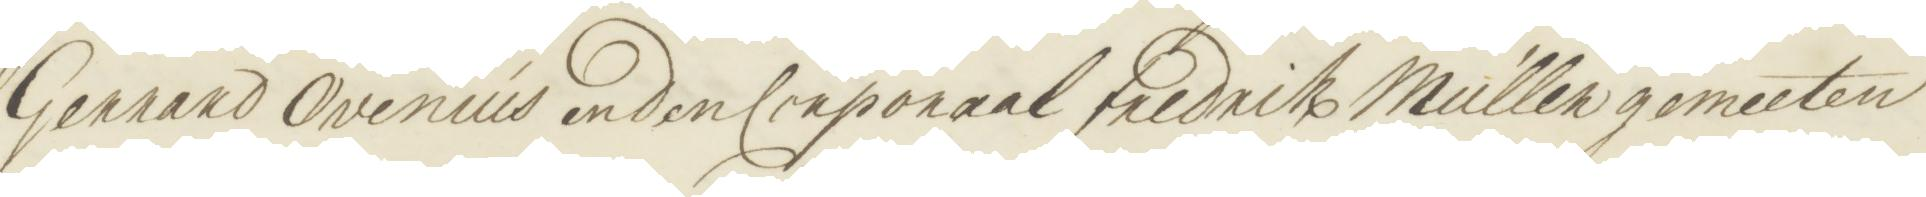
Gerrard Ovenius en den Corporaal fredrik Muller gemeeten
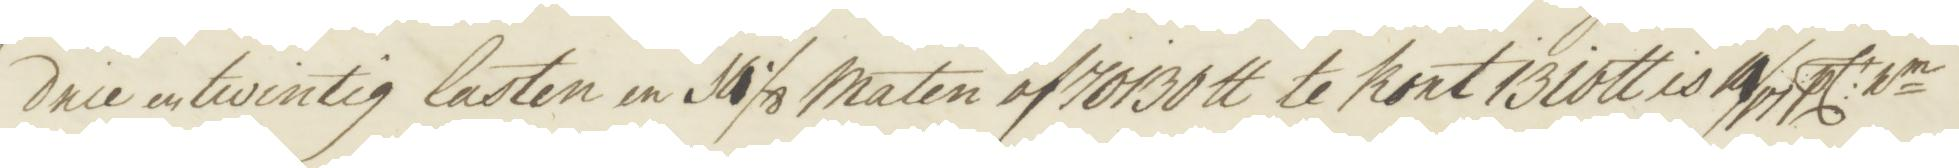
drie en twintig lasten en 14 1/8 maten of 70130 lb te kort 1310lb is 14/17 pC:t r=m
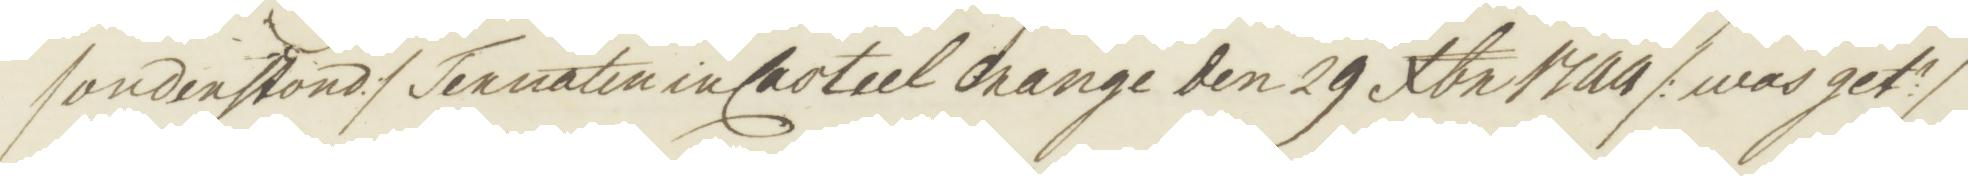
/onderstond:/ Ternaten in Casteel Orange den 29 xbr 1744 /: was get:t/
